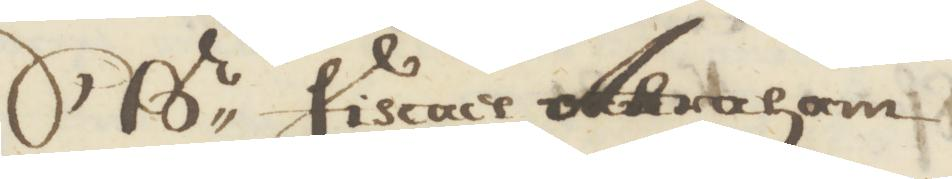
D H„r Fiscael Abraham
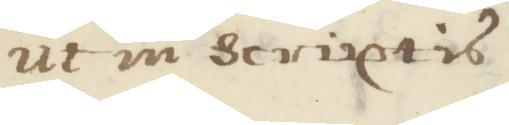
ut in scriptis
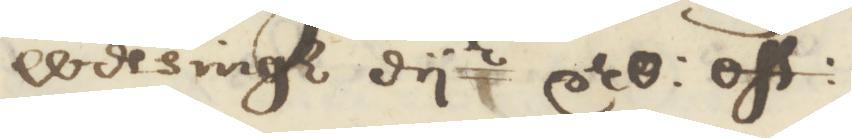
welsingh eij=r no: off:
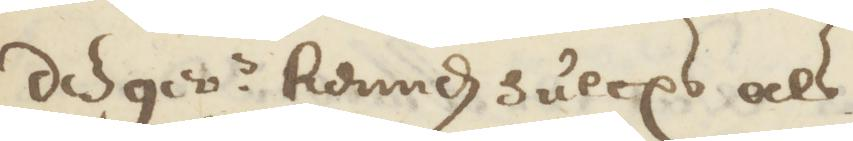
den gev:s kennen sulcxs als
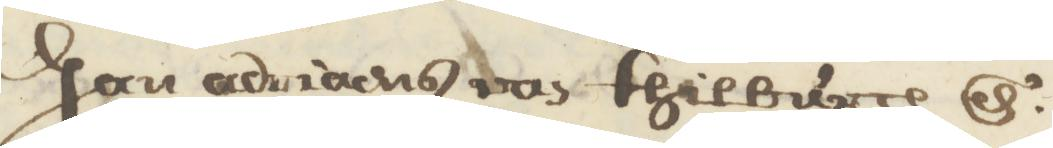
Jan adriaens van Thilburch ende
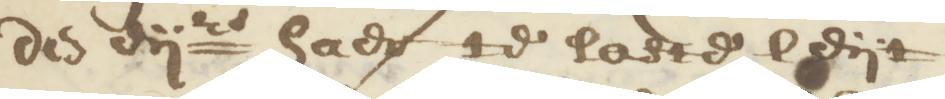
den eij=rs haer te laste leijt
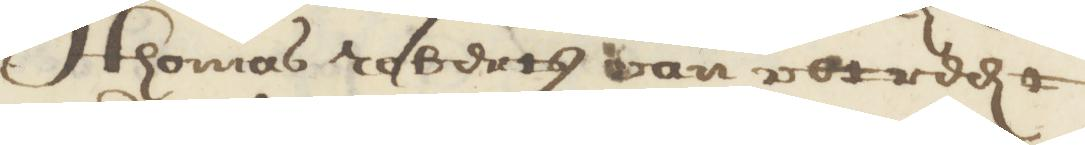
Thomas roberts van wtrecht
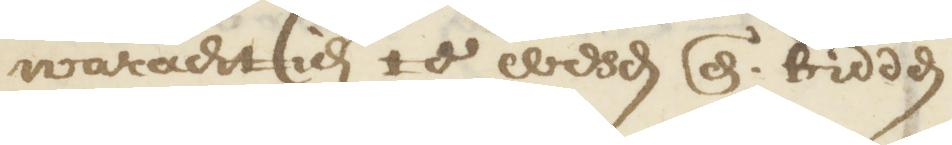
warachtich te wesen ende bidden
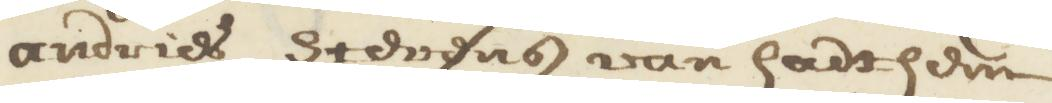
andries stevens van hadthem
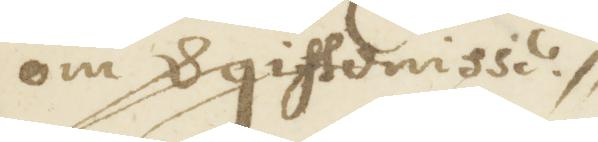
om vergiffenisse./
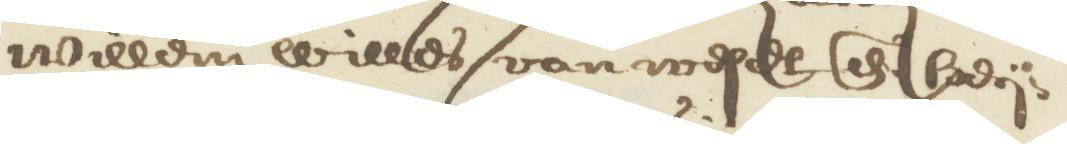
willem willes van wesel ende heijn
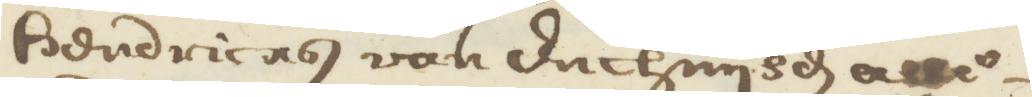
Hendricxs van Enchuijsen alle —
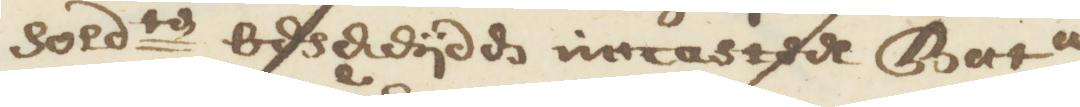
sold=ten bescheijden intcasteel Bat.a
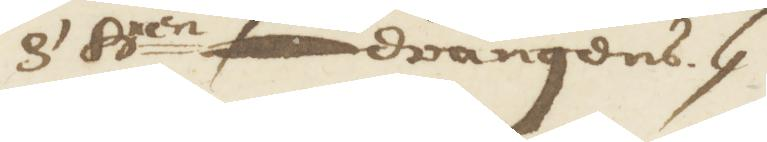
s H=ren Gevangens. /
